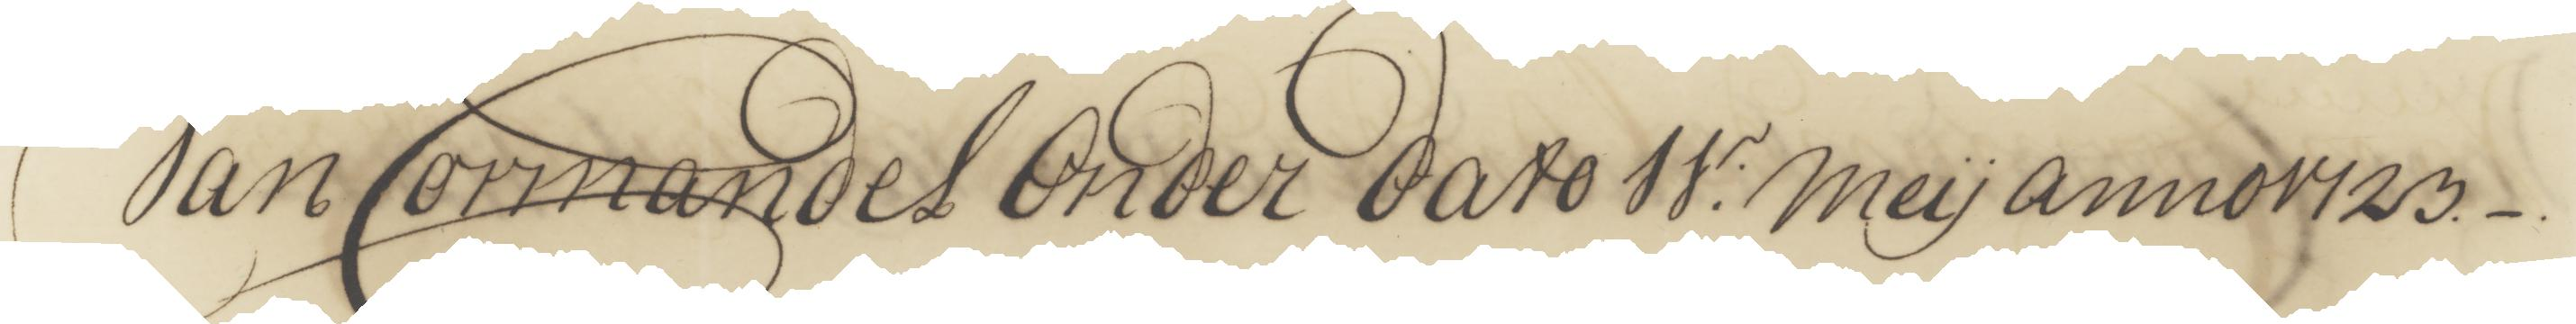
Van Cormandel Onder dato 11:' meij anno 1723. — .
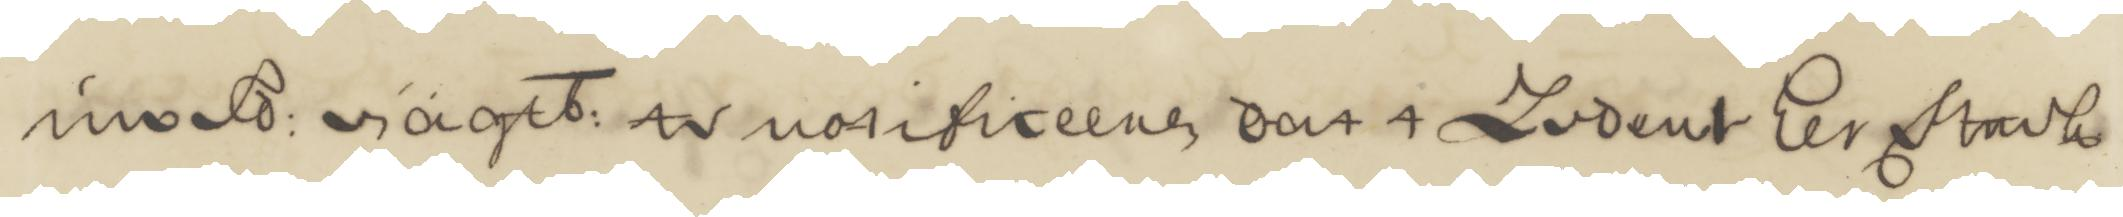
uw Ed: en agtb: te notificeeren dat t zedert het vertrek
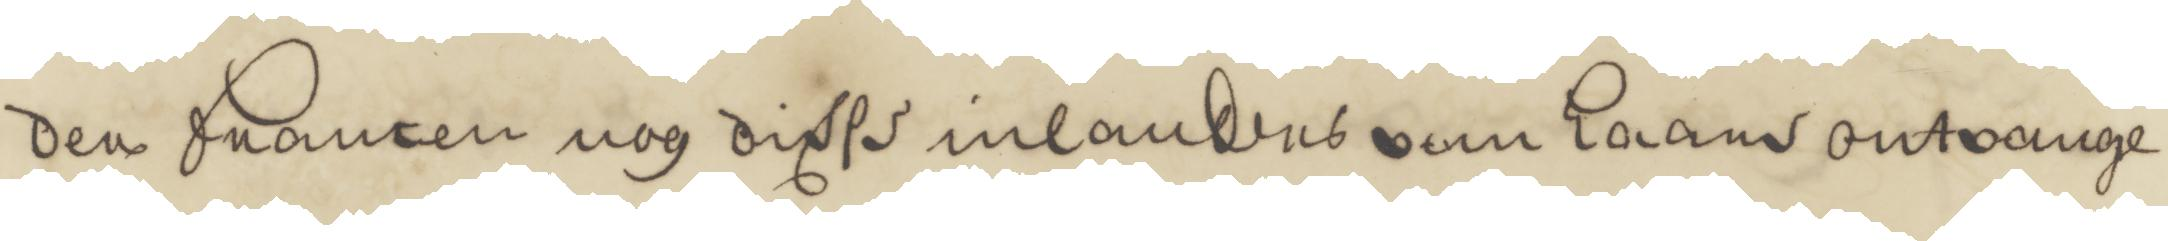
der Francen nog diverse inlanders van haare ontvange
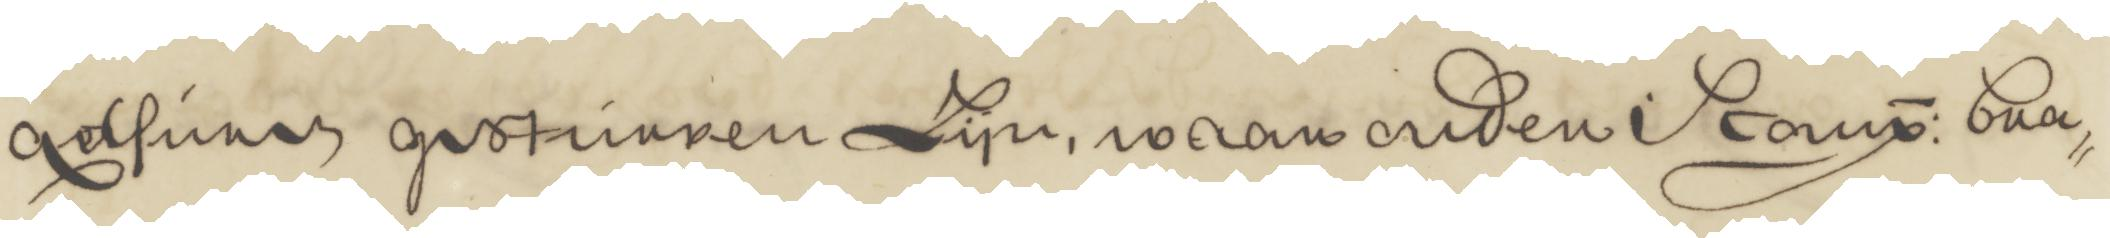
qetsuren gesturven zijn, waar onder Ecomp: bra„
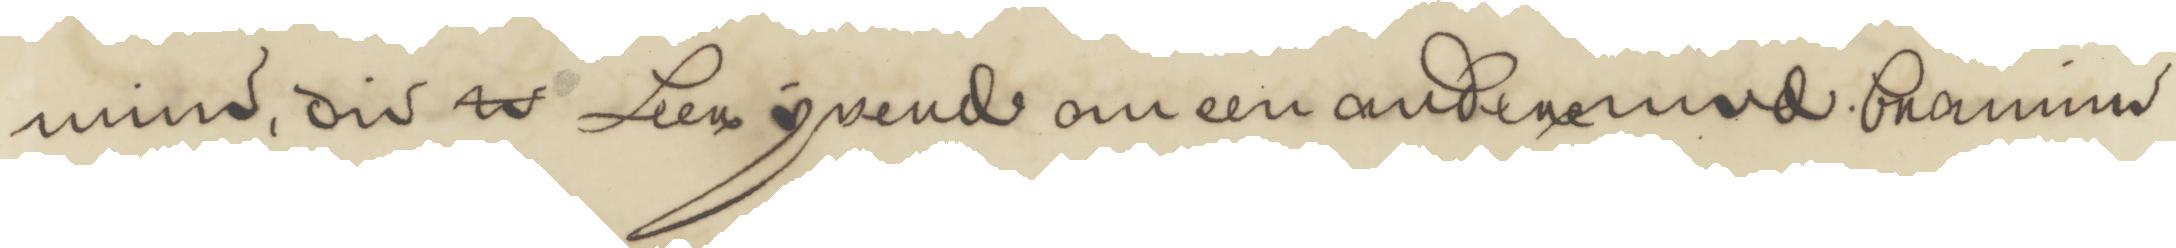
mine, die te seer ijverde om een andere mede bramine
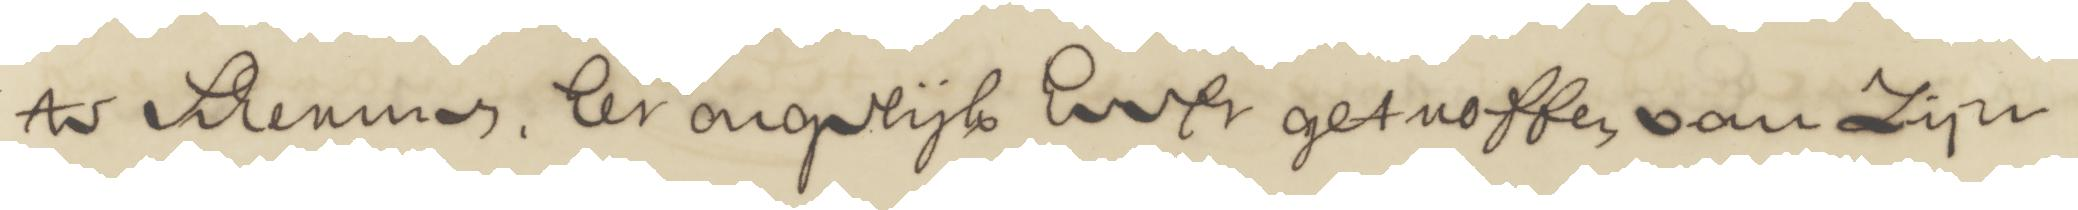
te schermen, het ongelijk heeft getroffen van zijn
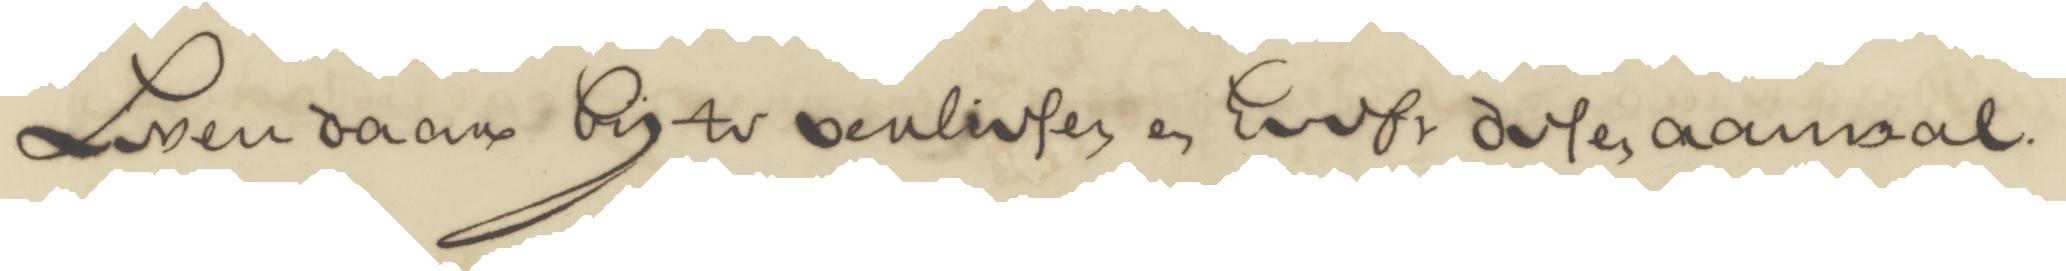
Leven daar bij te verliesen en heeft desen aanval.
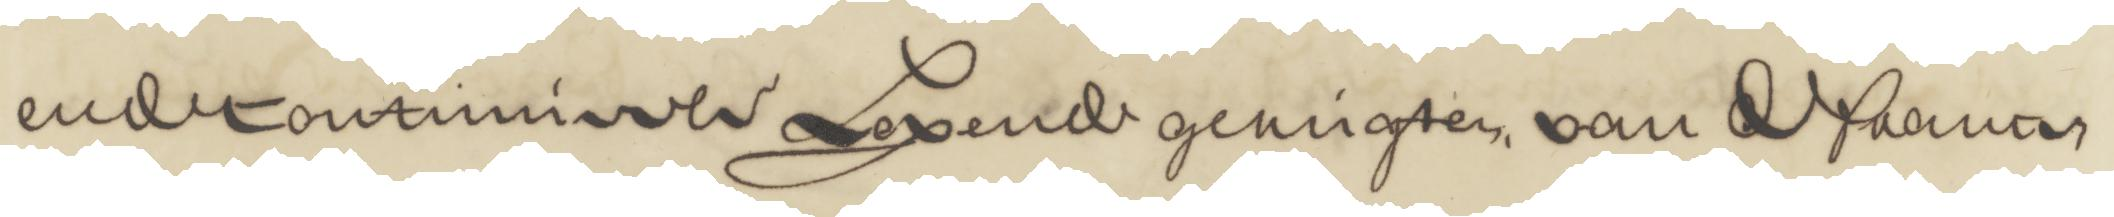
ende continueele Lopende gerugten van de francen
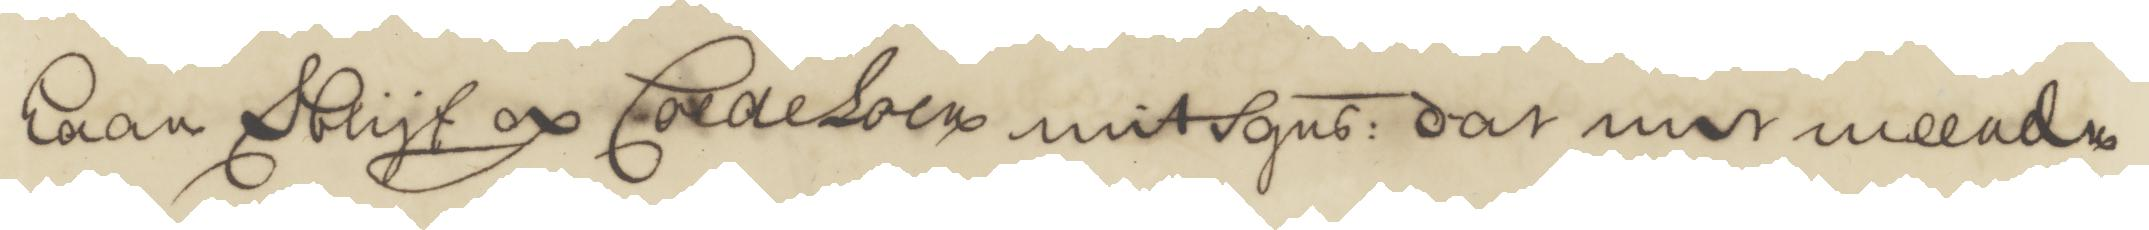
haar verblijf op Coldeloer mitsgrs: dat met meerdr
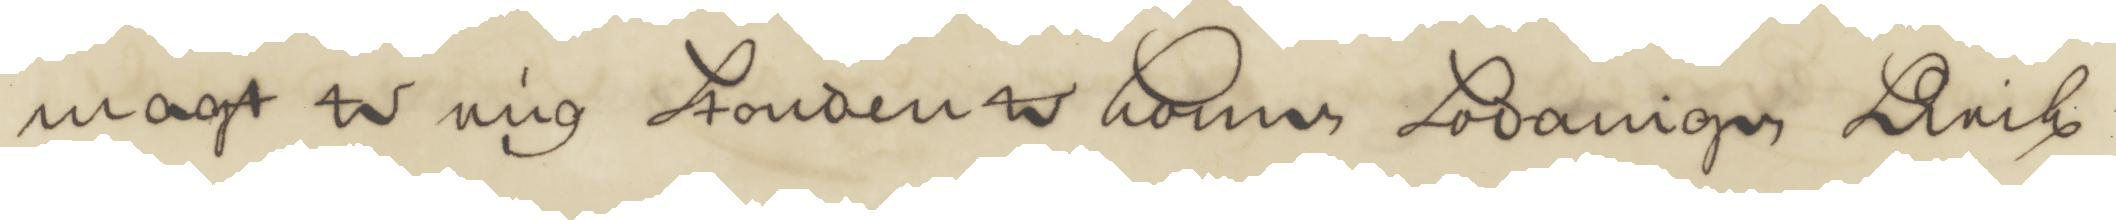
magt te rug stonden te komen sodanigen schrik
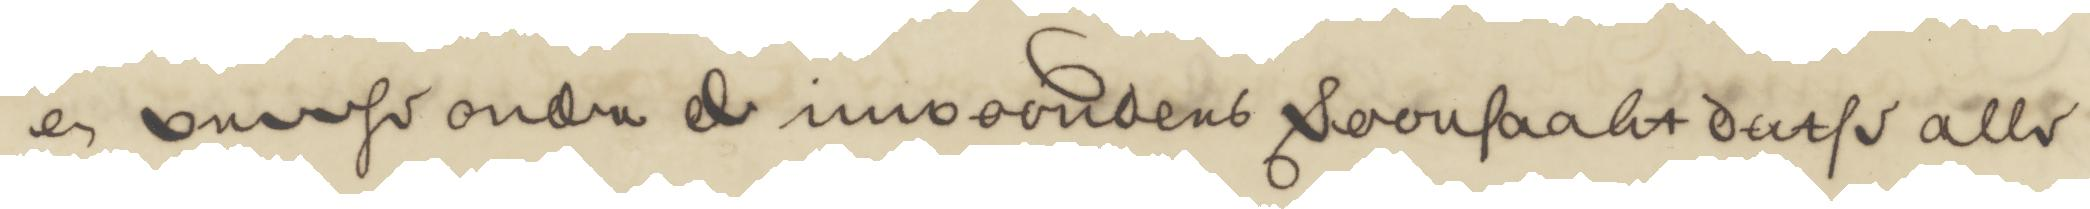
en vreese onder de inwoonders veroorsaakt datse alle
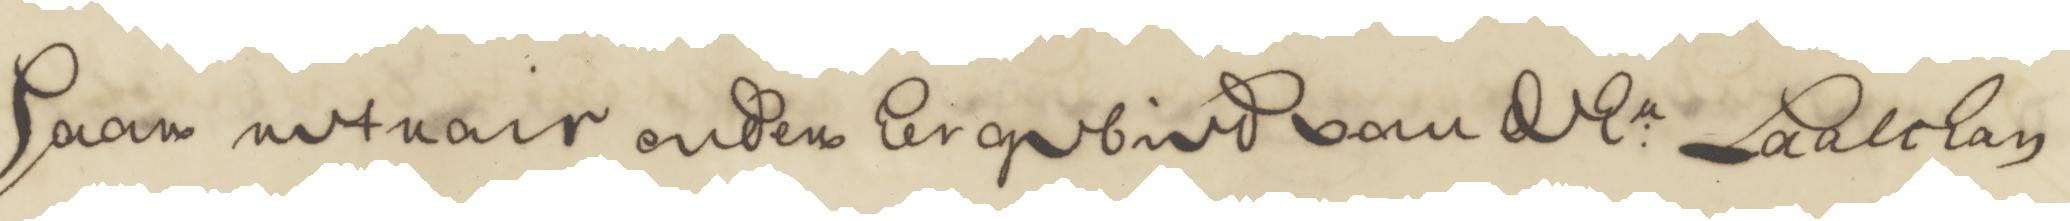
Jaar retrair onder het gebied van de h:r Laalchan
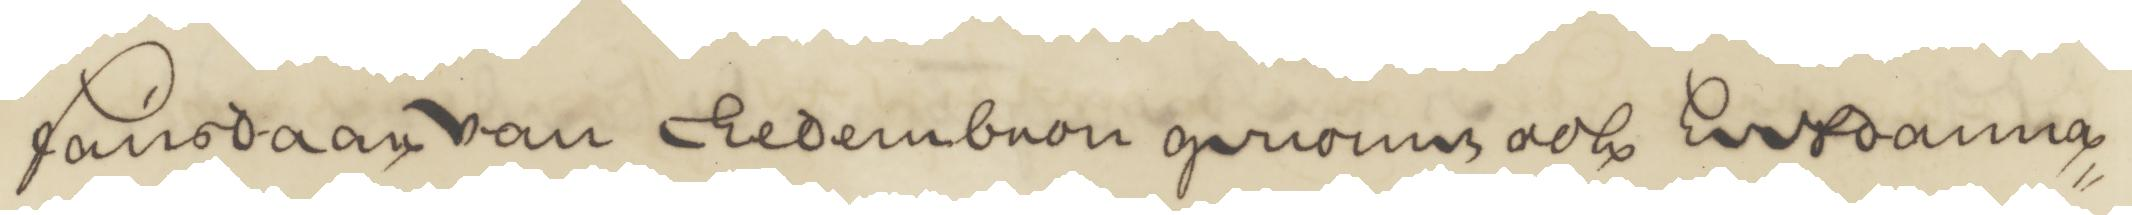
Fausdaar van chedembron genomen ook heefdanna„
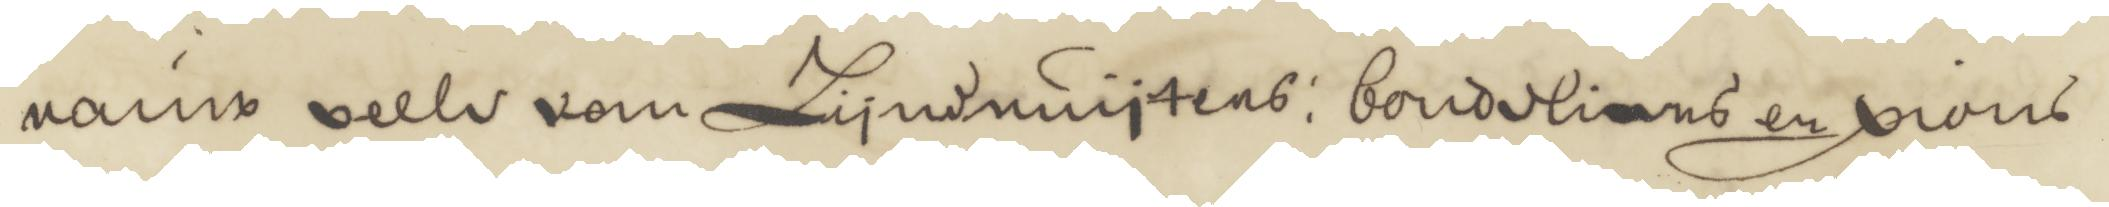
rauw veele van Zijne ruijters: bondeliers en pions
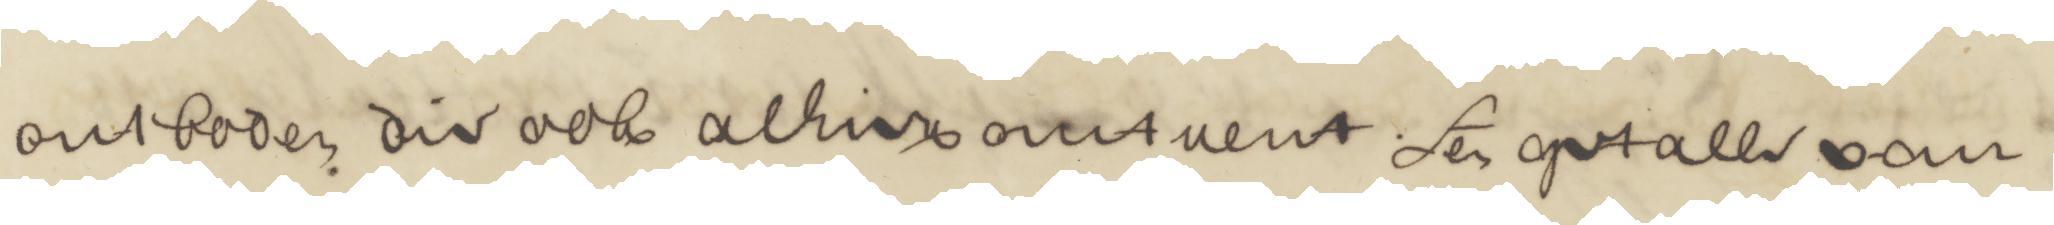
ontboden die ook alhier omtrent ten getalle van
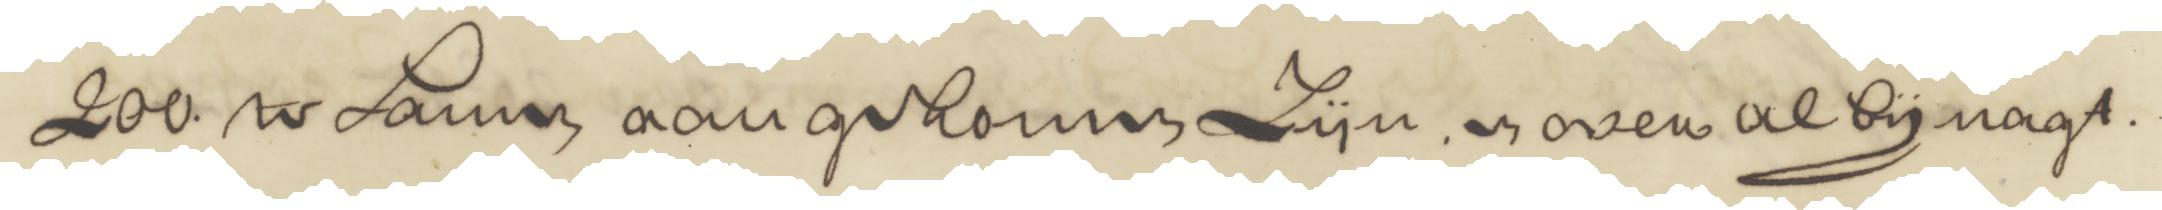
200. te samen aangekomen zijn, en over al bij nagt.
